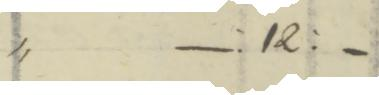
„ —:12:—
